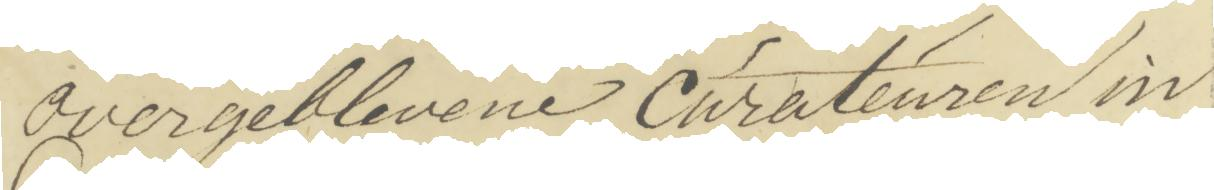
overgeblevene Curateuren in
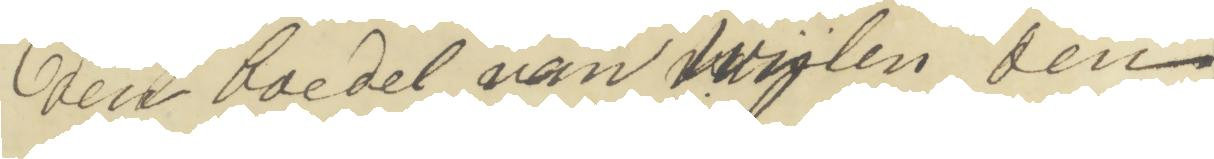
den boedel van wijlen den
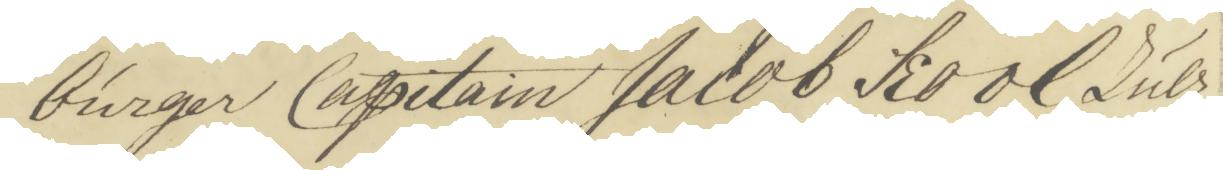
burger Capitain Jacob kool zulx
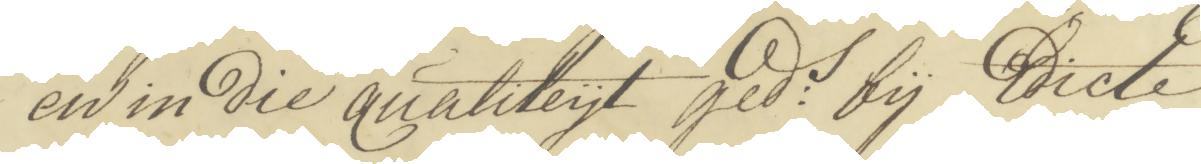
en in die qualiteijt ged:s bij Edicte
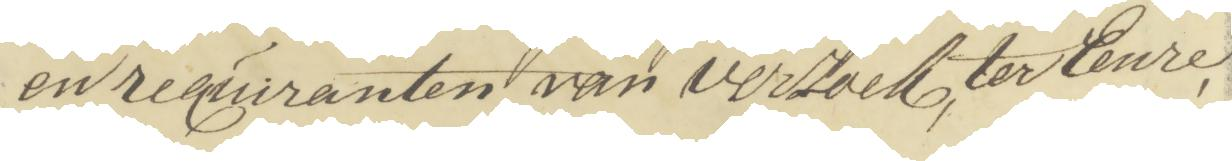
en requiranten van verzoek, ter Eenre,
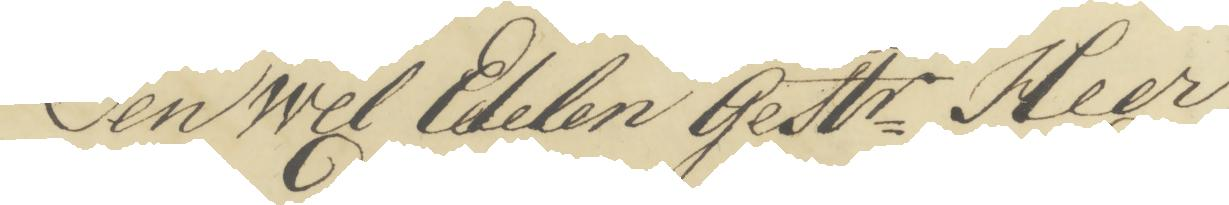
Den wel Edelen Gest=r Heer
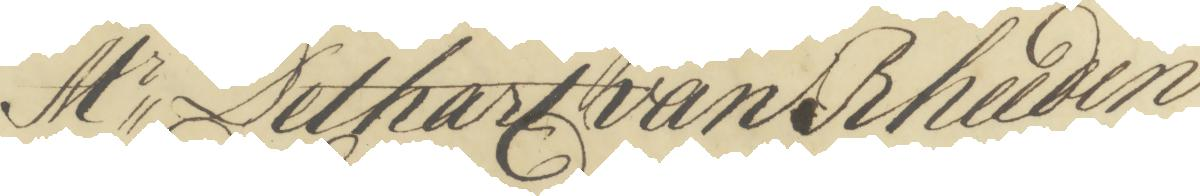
M„r Dethart van Rheeden
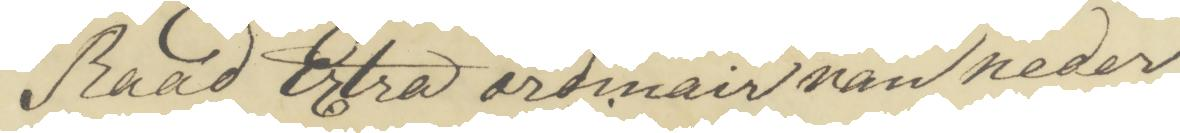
Raad Extra ordinair van neder
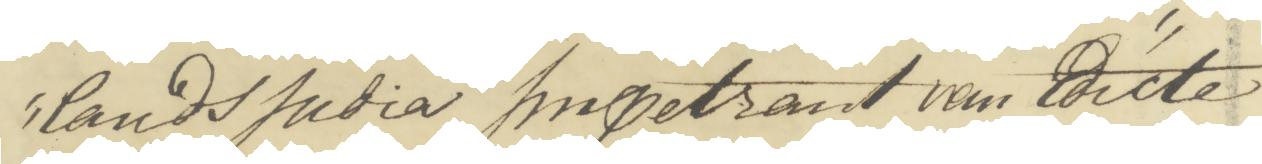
„lands Jndia, Impetrant van Edicte
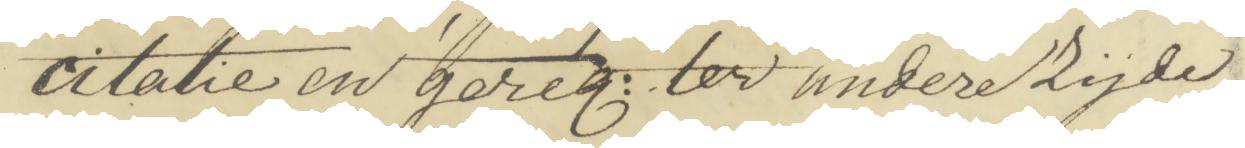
citatie en gereq: ter andere zijde
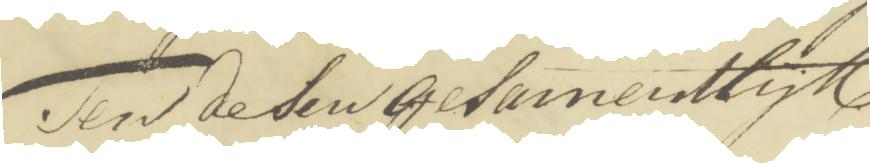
Ten desen gesamentlijk
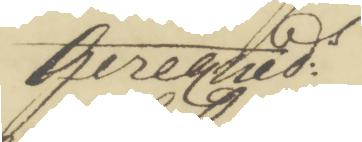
Gerequed:s
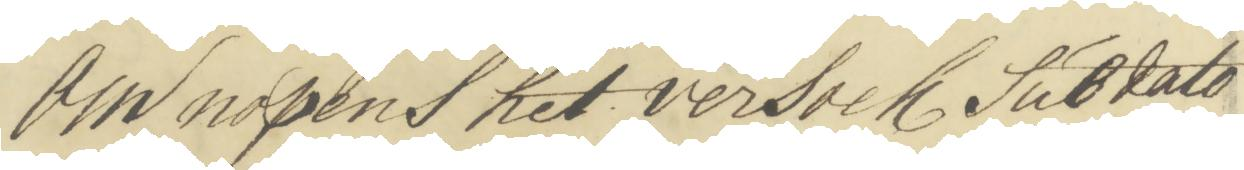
Om nopens het versoek sub dato
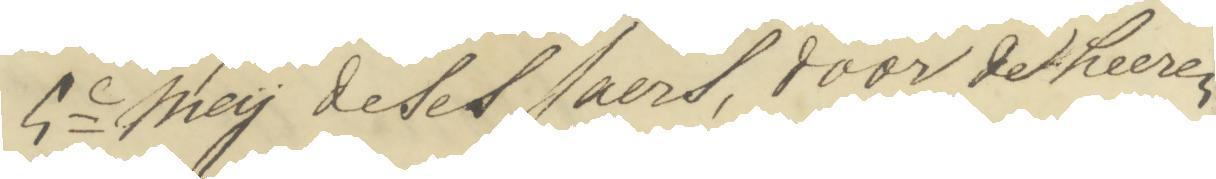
5=e meij deses Jaers, door de heeren
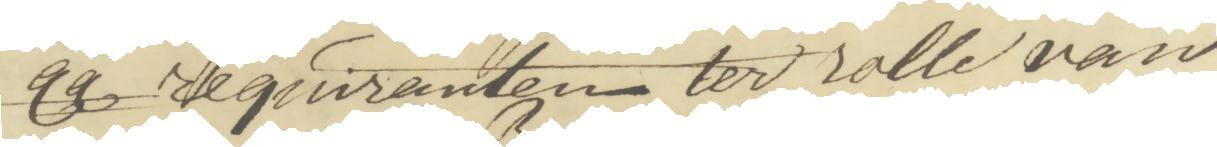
qq requiranten ter rolle van
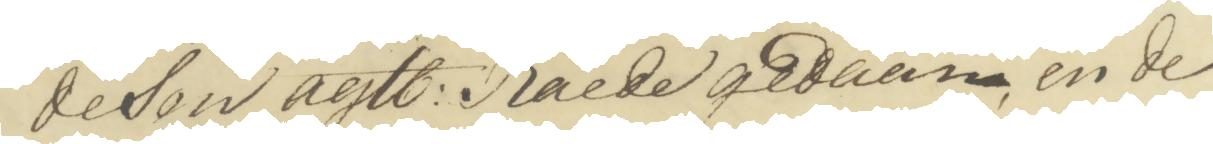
desen agtb: Raede gedaan en de
